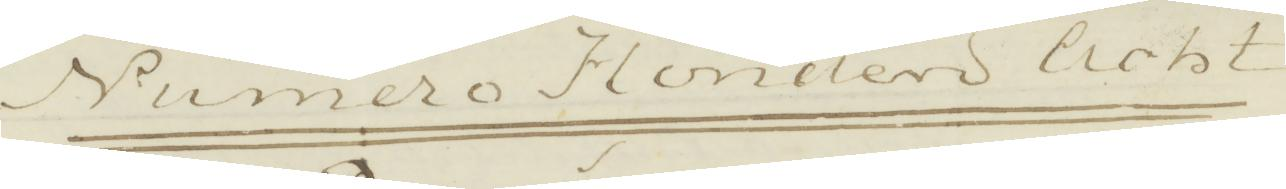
Numero Honderd acht
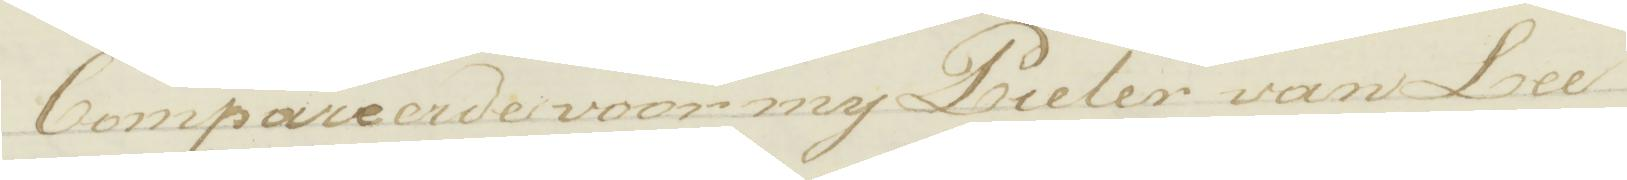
Compareerde voor mij Pieter van Lee
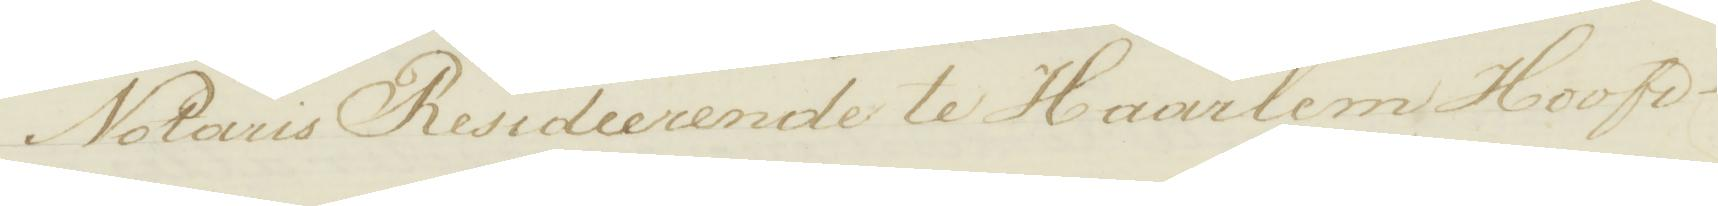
Notaris Resideerende te Haarlem Hoofd-
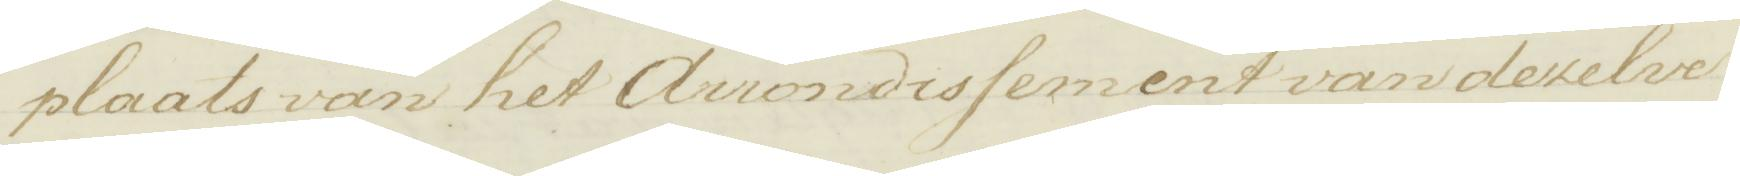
plaats van het Arrondissement van dezelve
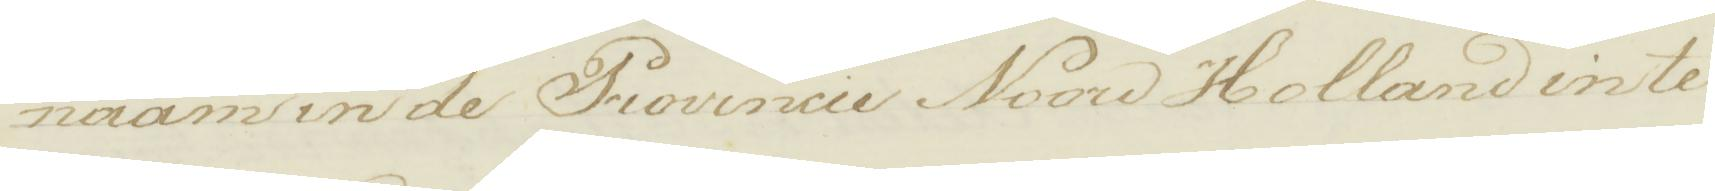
naam in de Provincie Noord Holland in te
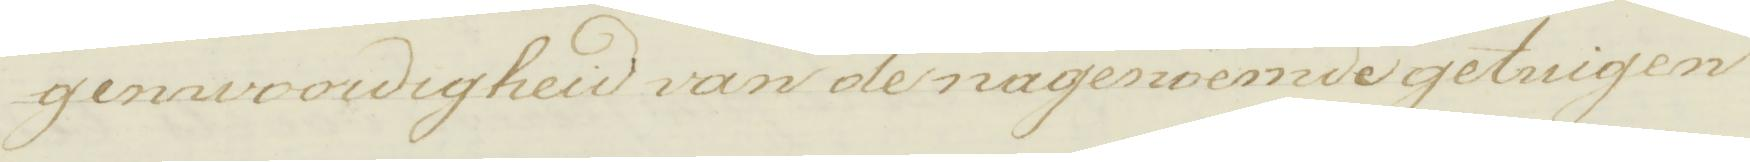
genwoordigheid van de nagenoemde getuigen
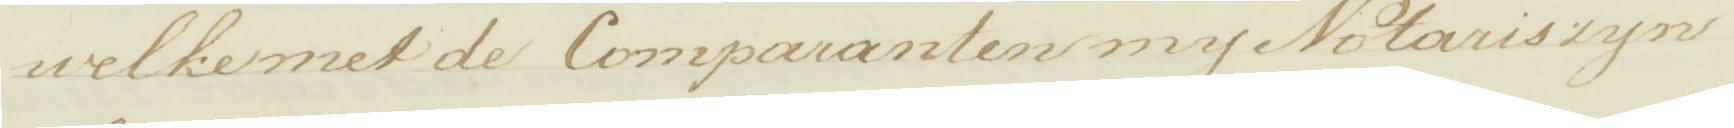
welke met de Comparanten my Notaris zyn
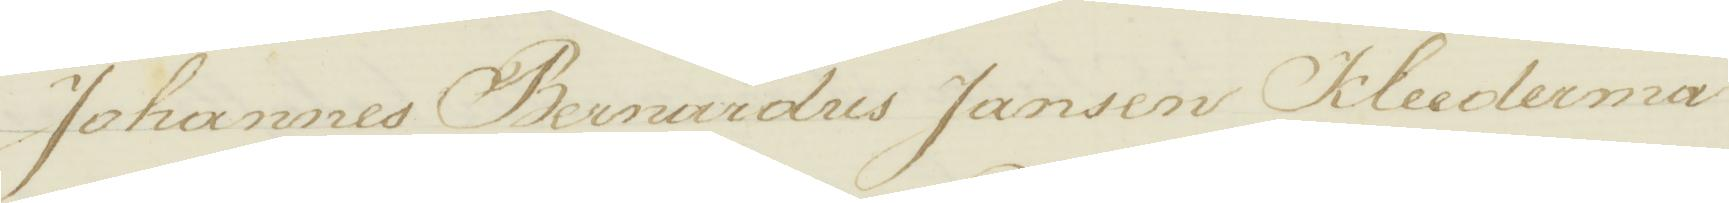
Johannes Bernardus Jansen Kleederma
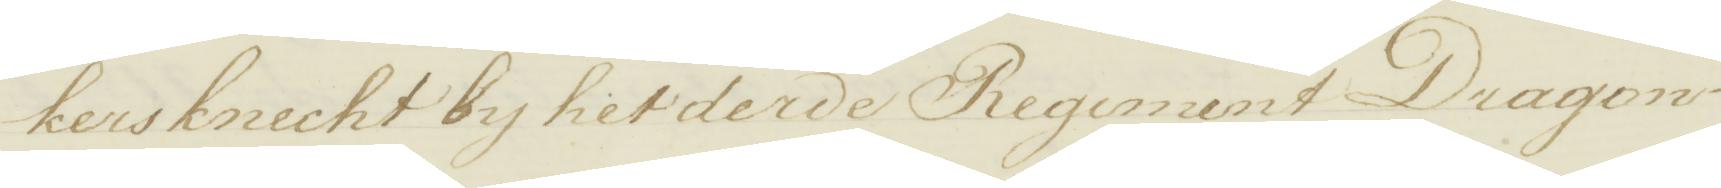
kersknecht by het derde Regiment Dragon
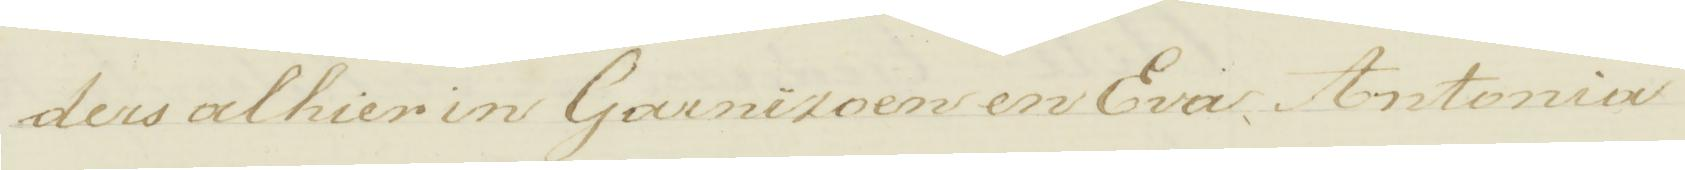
-ders alhier in Garnizoen en Eva Antonia
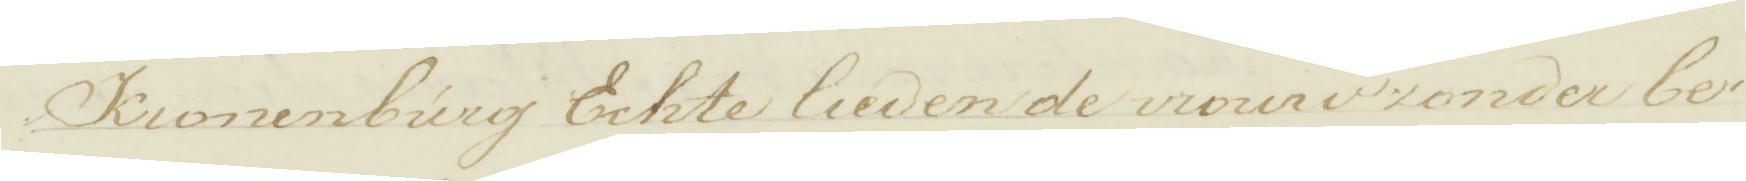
Kronenburg Echte lieden de vrouw zonder be
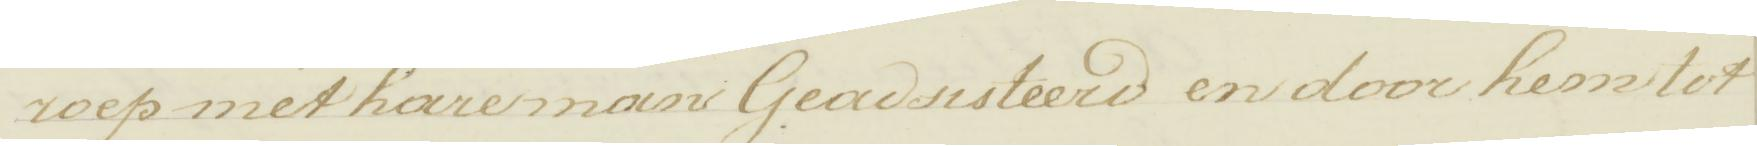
roep met hare man Geadsisteerd en door hem tot
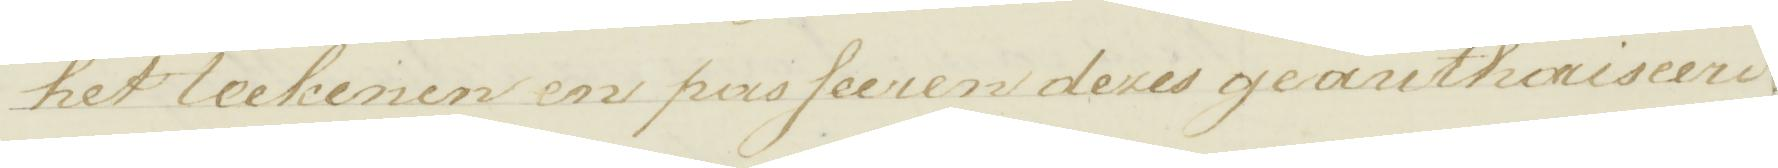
het teekenen en passeeren dezes geauthoriseerd
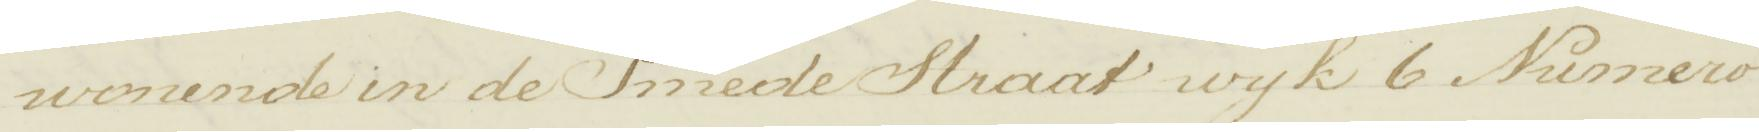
wonende in de Smede Straat wyk 6 Numero
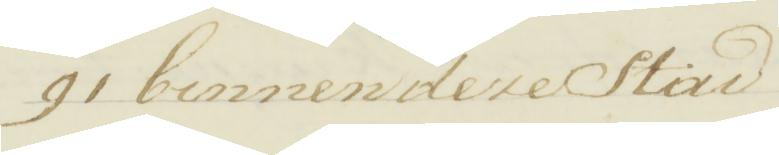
91 binnen deze Stad
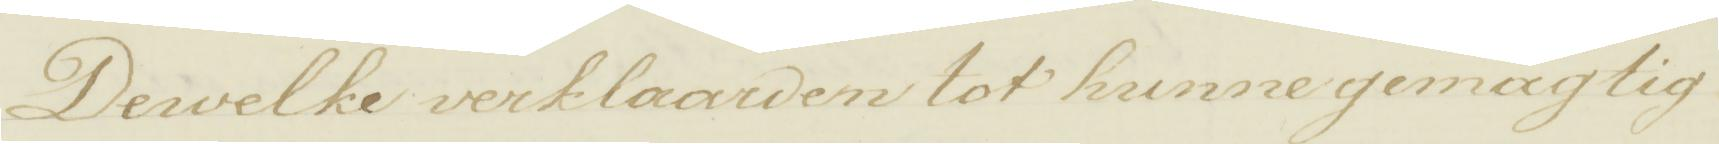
Dewelke verklaarden tot hunne gemagtig
